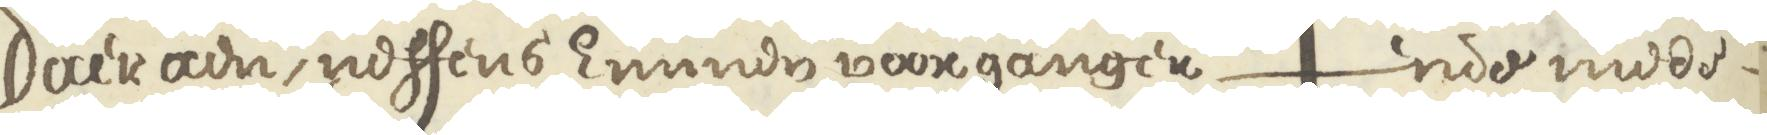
daer aen, neffens hunnen voorganger ende mede-
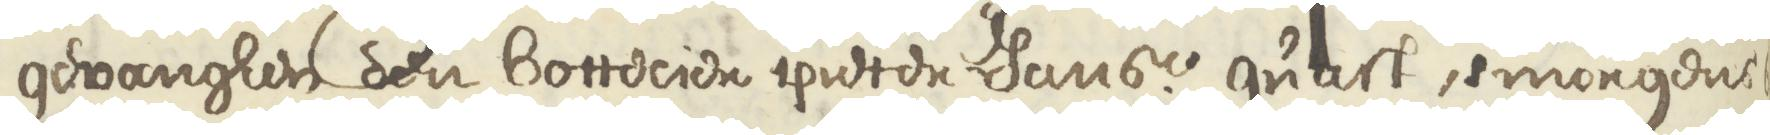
gevanghen den bottelier pieter Ians. quast, smorgens
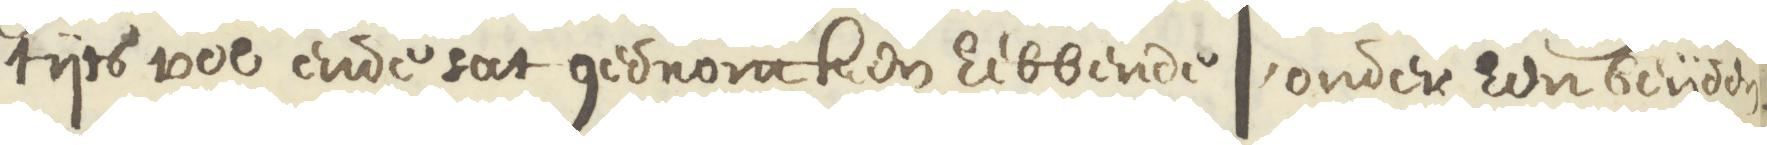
tijts vol ende sat gedroncken hebbende, onder hen beijden
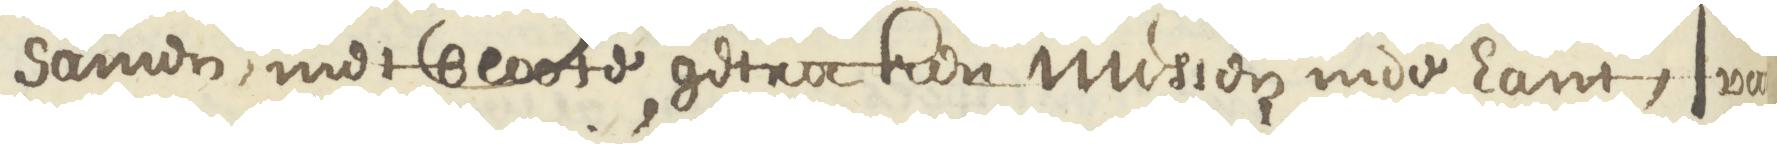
samen, met bloote getrocken messen in de hant, vo
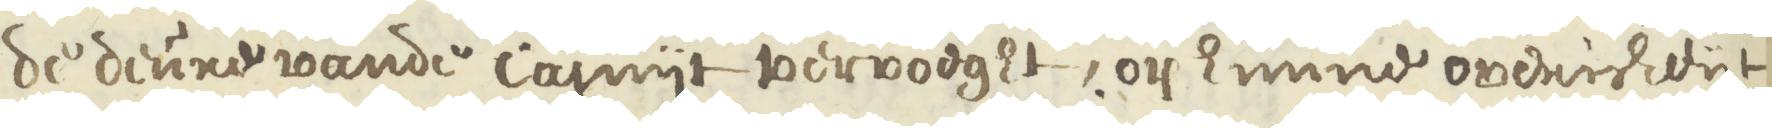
de deure vande Cajuijt vervoeght, op hunne overicheijt
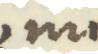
mi
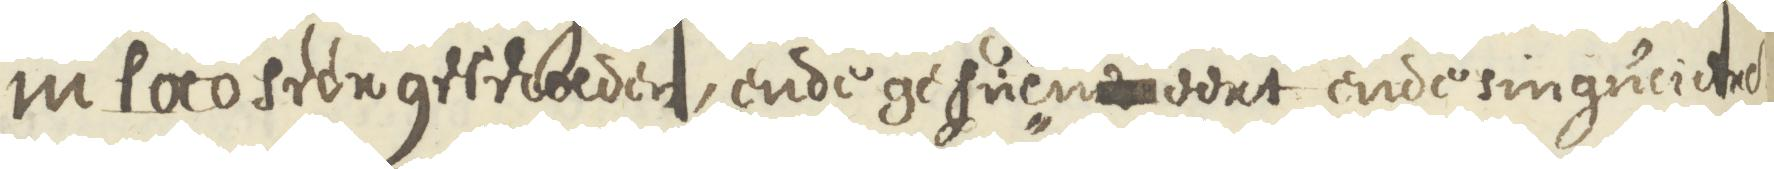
in loco seer geschaden, ende gegul„n eert ende singuliere
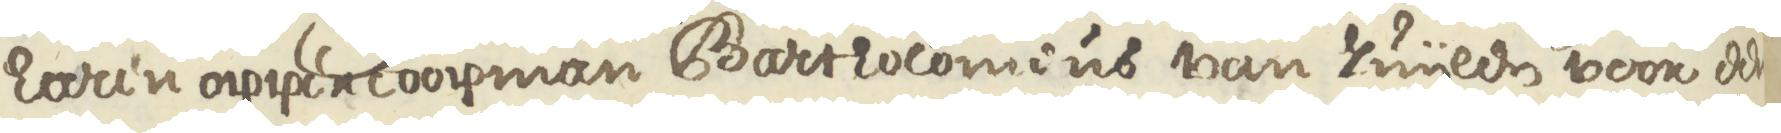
haren oppercoopman Bartholomeus van Zuijlen voor den
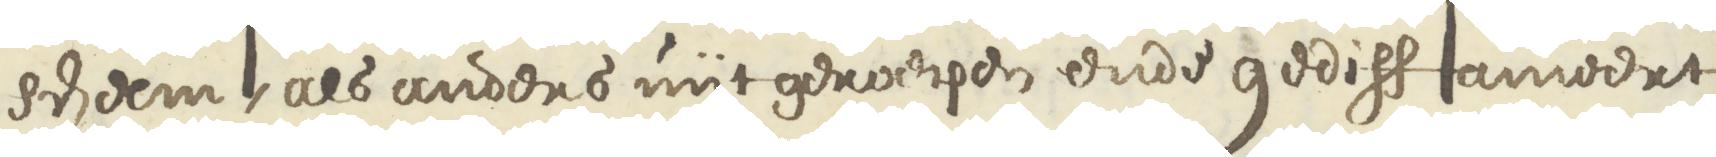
schelm, als anders uijt geroepen ende gediffameert
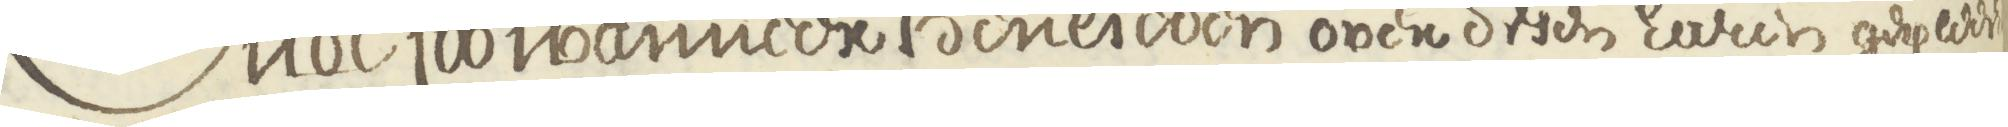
Ende soo wanneer hen lieden over desen heeren gepleec
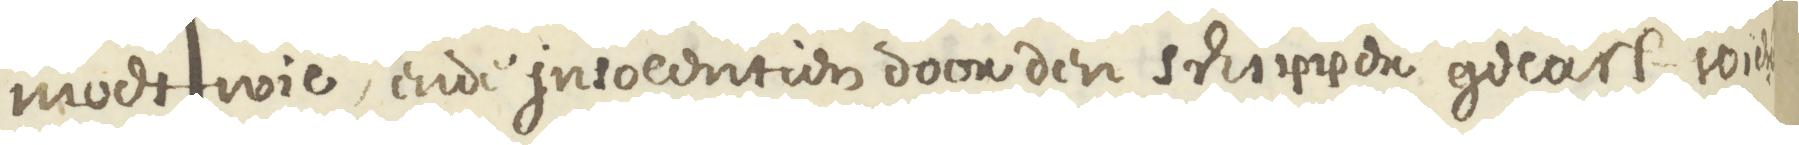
moet wil, ende insolentien door den schipper gelast wier
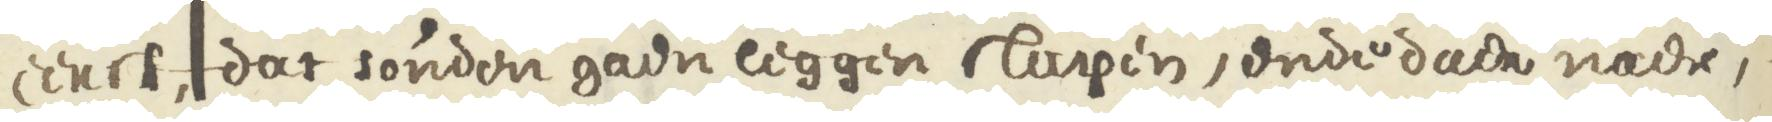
eerst, dat souden gaen leggen slapen, ende daer naer,
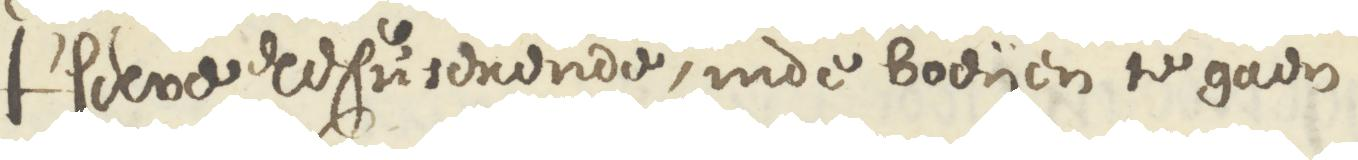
t'selve refuserende, inde boeijen te gaen.
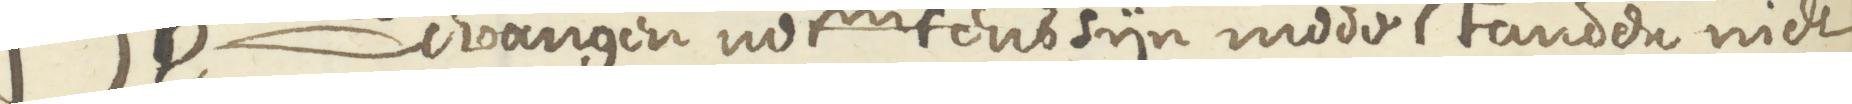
Hij Gevangen neffens sijn medestander niet
